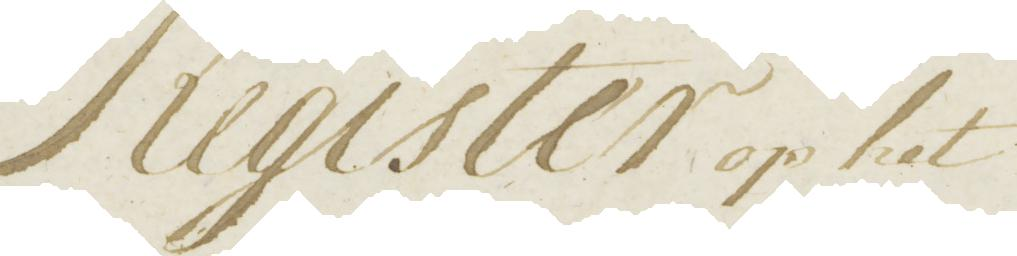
Register op het
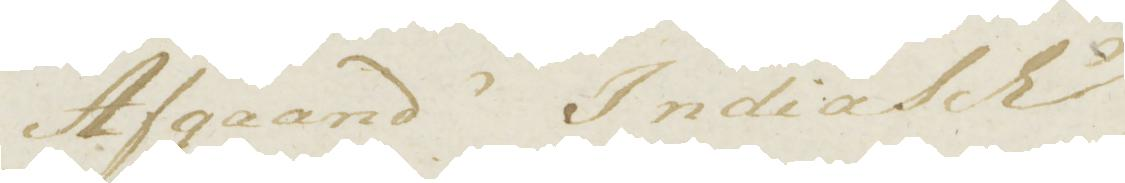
Afgaand ' Indiasch'
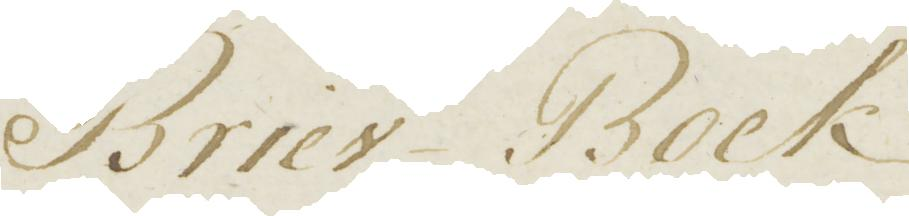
Briev-Boek
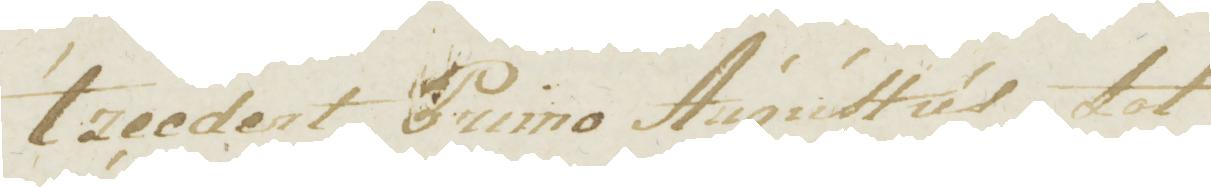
’t zeedert Primo Augustus tot
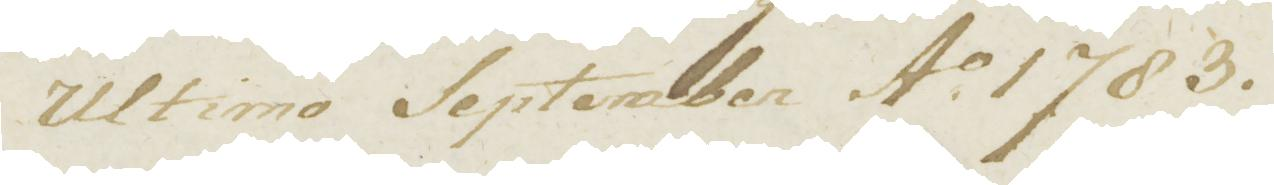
ultimo September A:o 1783.
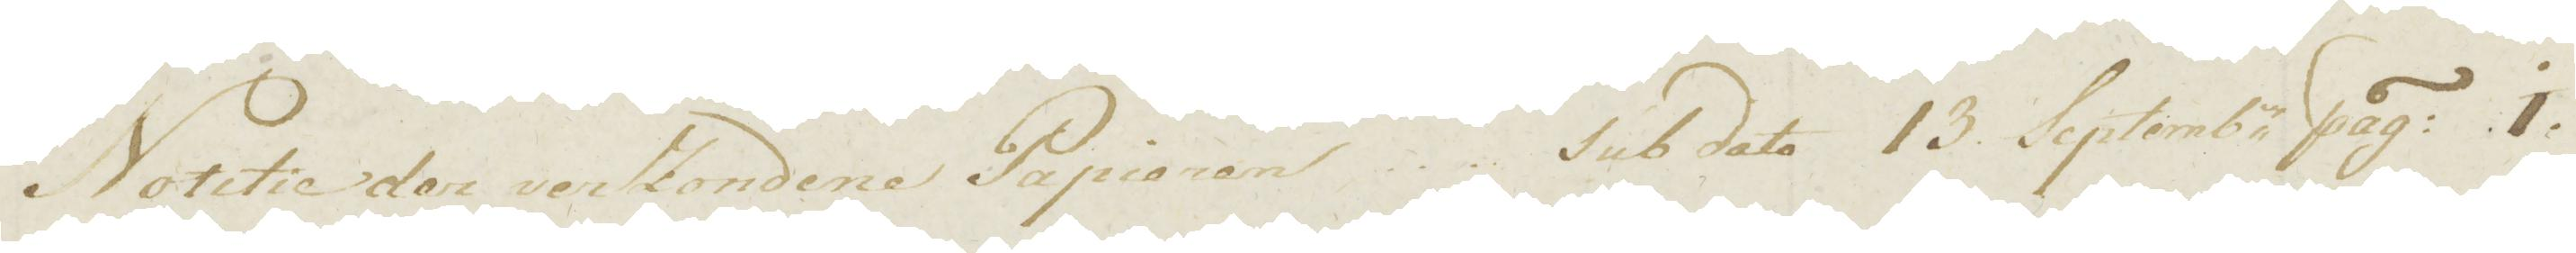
Notitie der verzondene Papieren sub dato 13. Septemb:er pag: 1.
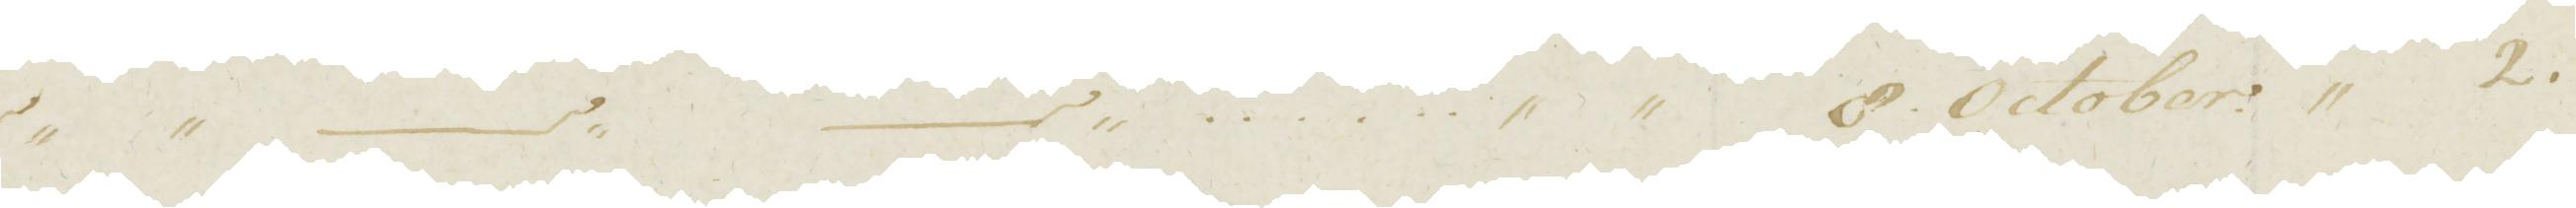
„ „ — „ — „ „ „ 8. October „ 2.
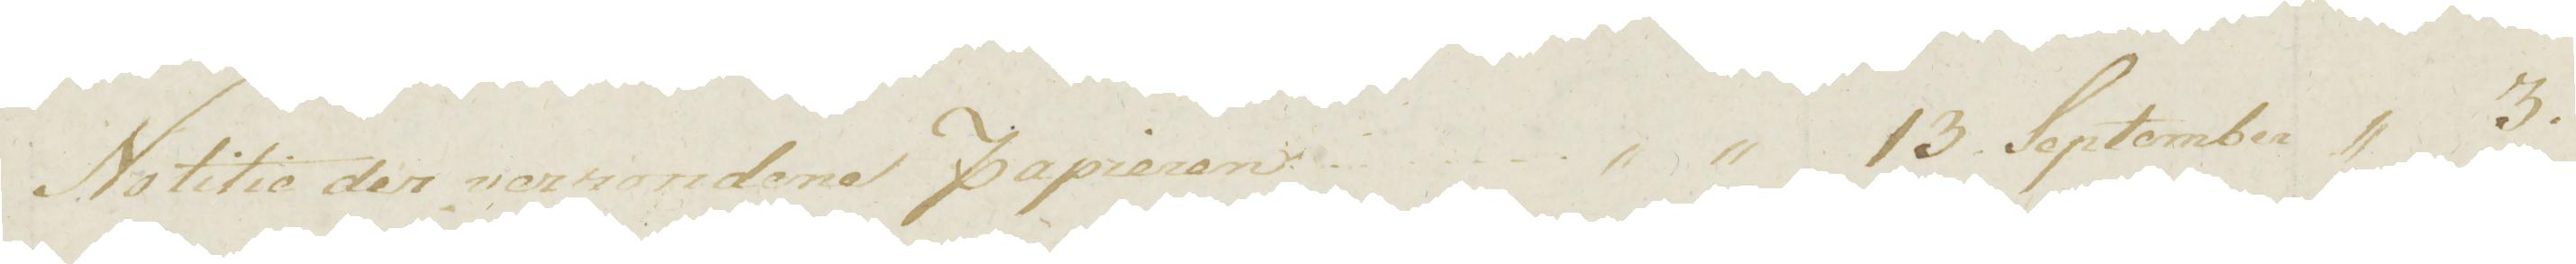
Notitie der verzondene Papieren „ „ „ 13. September „ 3.
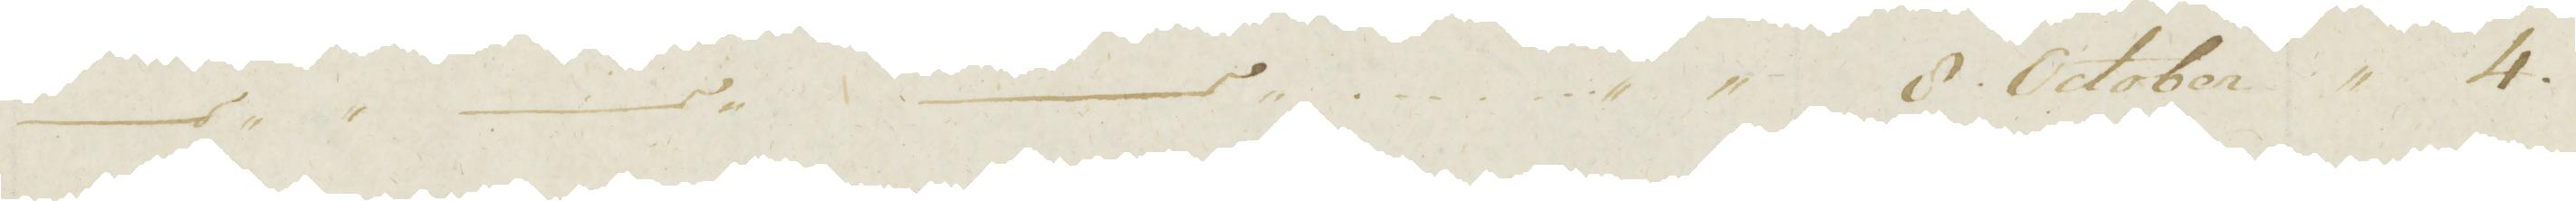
— „ „ — „ — „ „ „ 8. October „ 4.
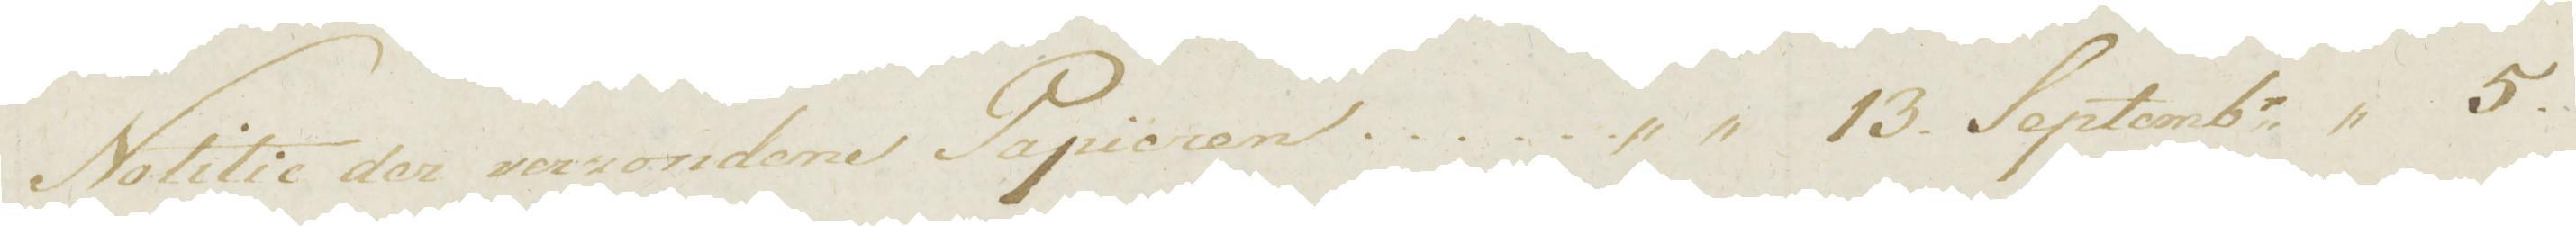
Notitie der verzondene Papieren „ „ 13. Septemb:r „ 5.
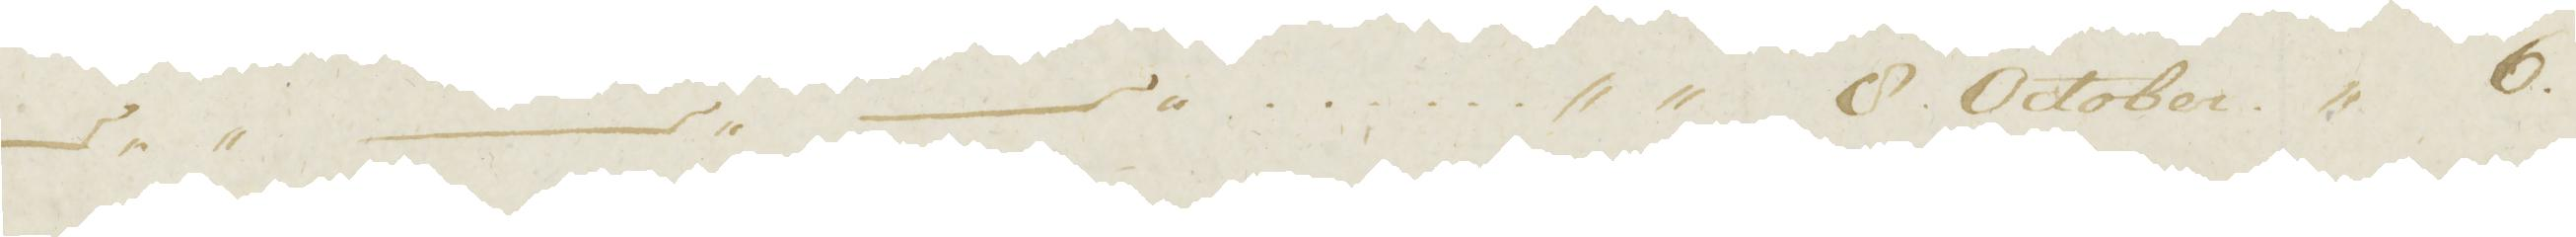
— „ „ — „ — „ „ „ 8. October . „ 6.
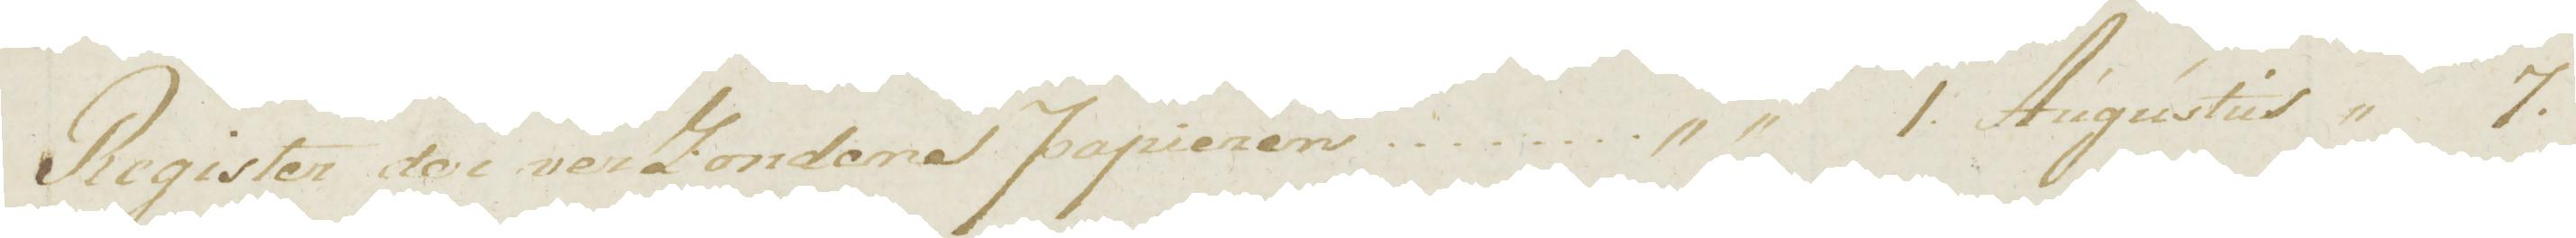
Register der verzondene Papieren „ „ 1. Augustus „ 7.
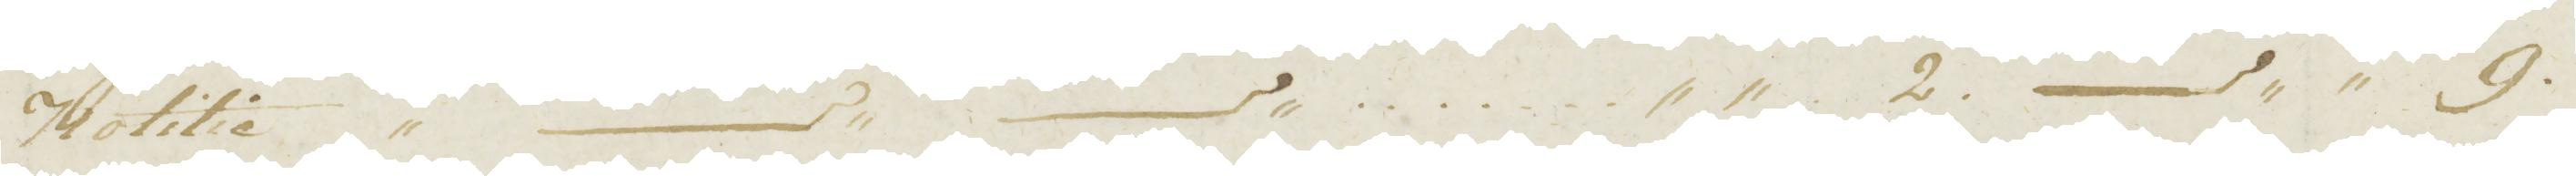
Notitie „ — „ — „ „ „ 2. — „ „ 9.
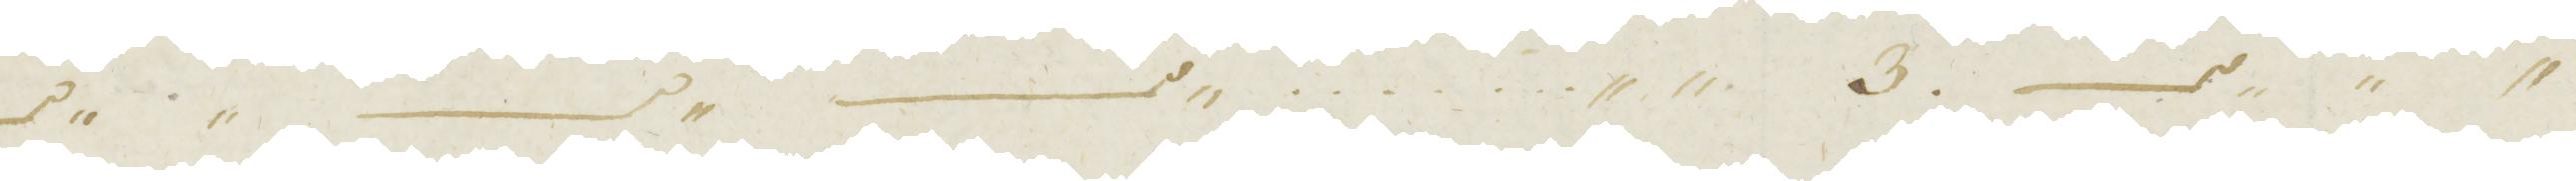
— „ „ — „ — „ „ „ 3. — „ „ „
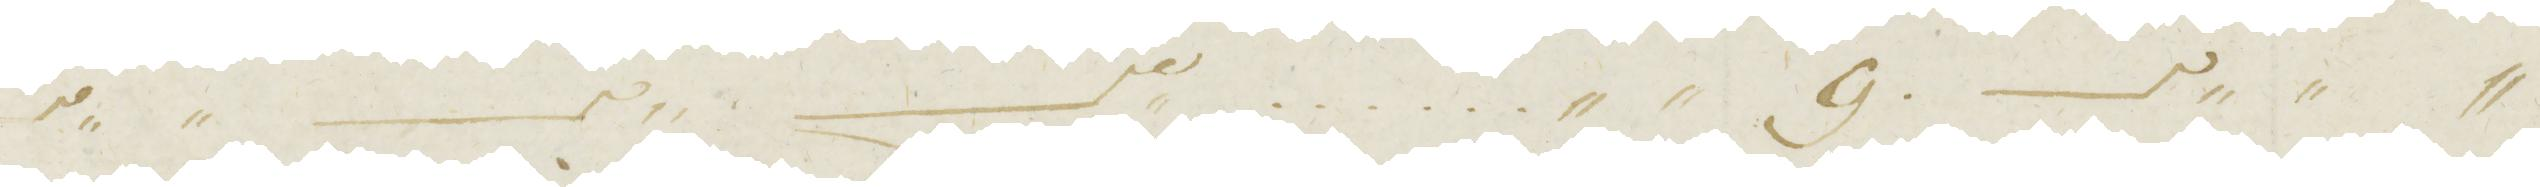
„ — „ — „ „ „ 9. — „ „ „
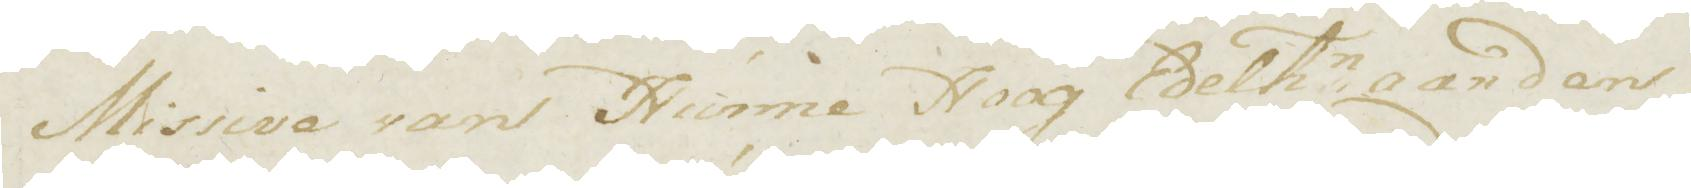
Missive van Hunne Hoog Edelh:n aan den
